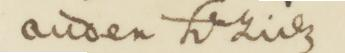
ander te zien
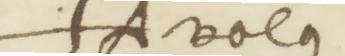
t vervolg
